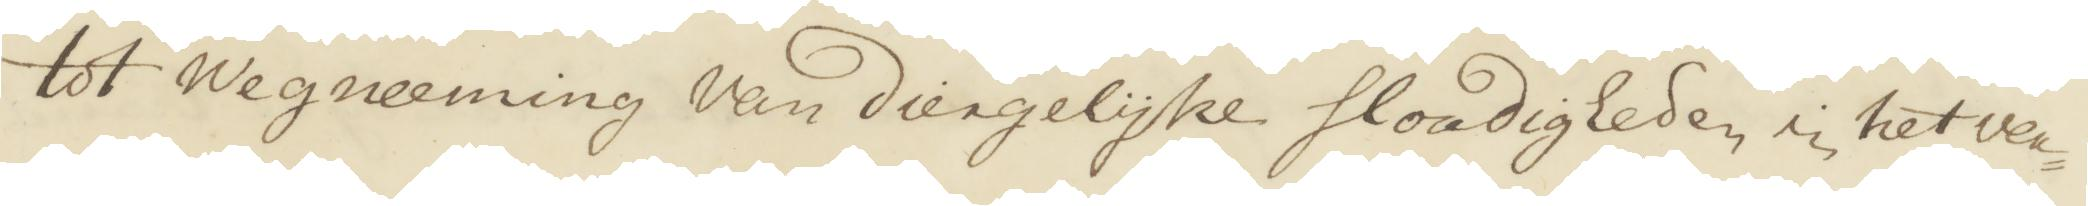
tot wegneeming van diergelijke slordigheden in het ver=
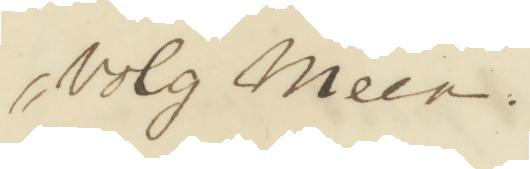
„volg meer.
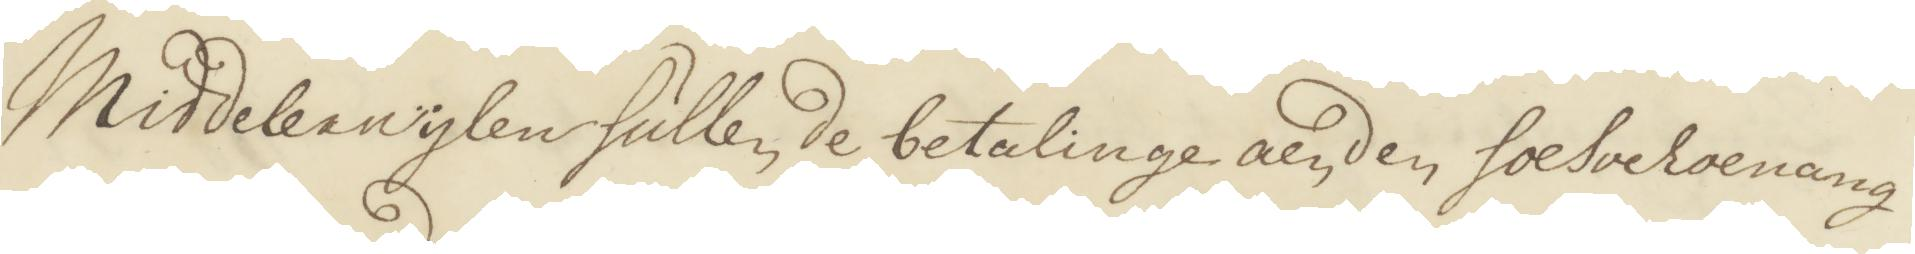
Middelerwijlen sullen de betalinge aen den soesoehoenang
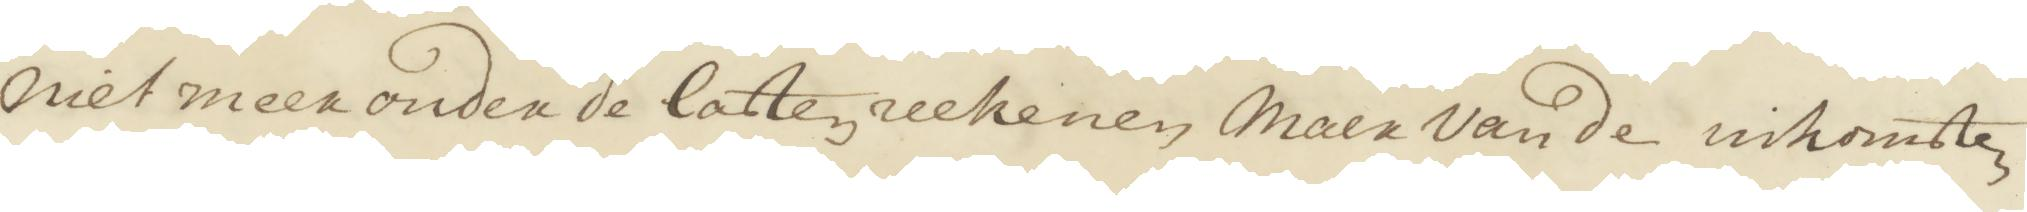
niet meer onder de lasten reekenen maer van de inkomsten
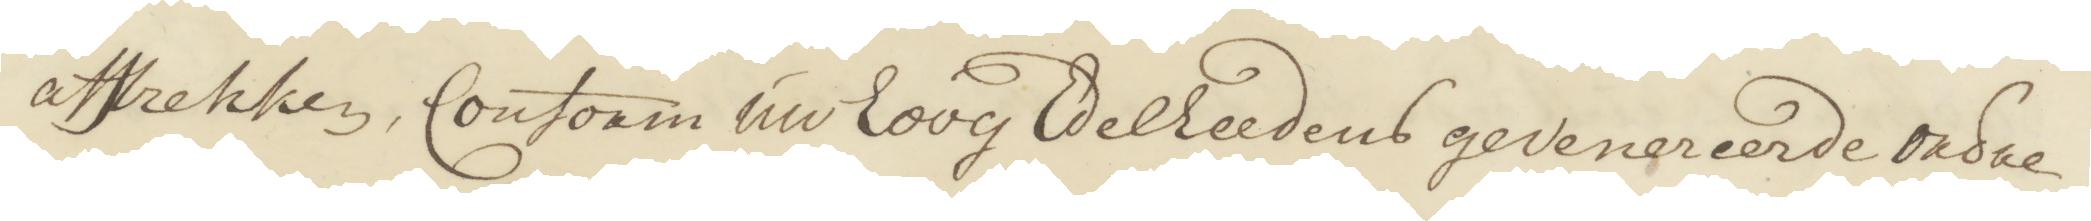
afftrekken, Conform uw hoog Edelheedens gevenereerde ordre
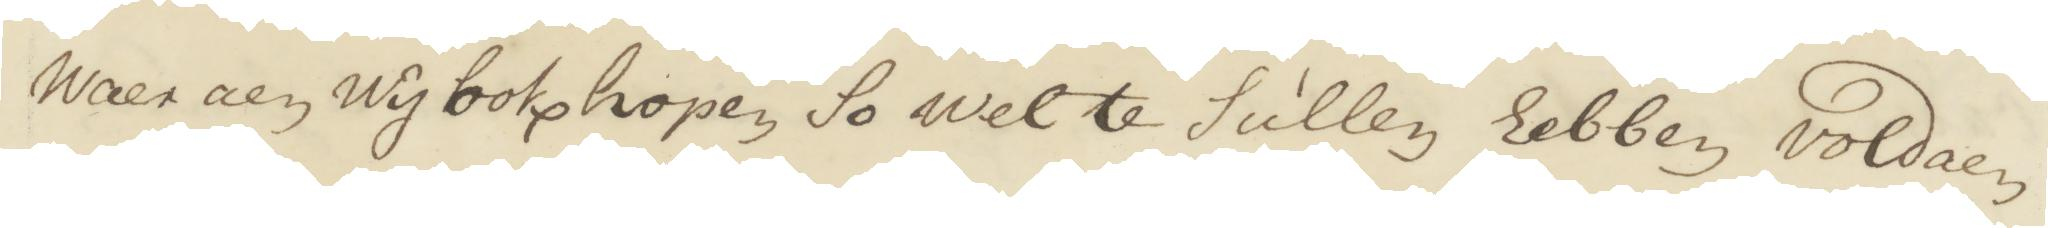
waer aen wij ook hopen so wel te sullen hebben voldaen
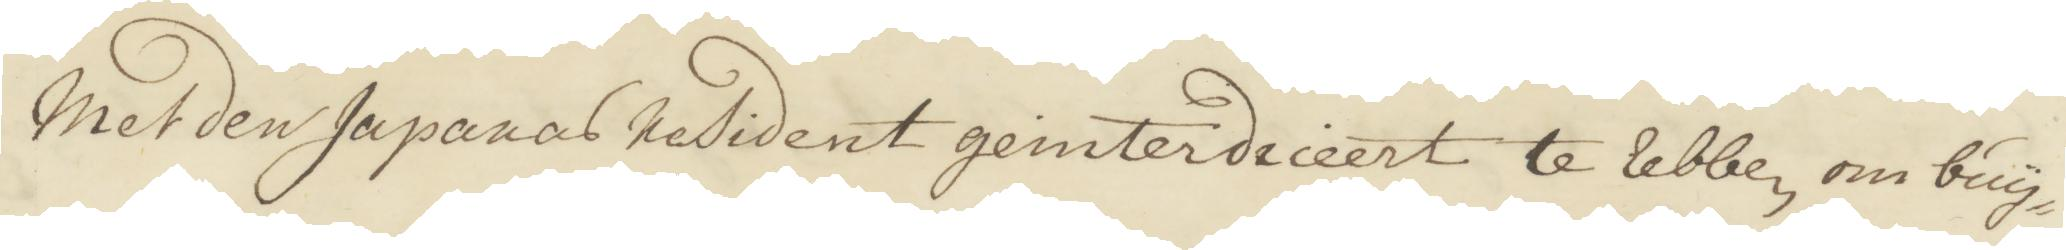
met den Japaras resident geinterdiceert te hebben om buij„
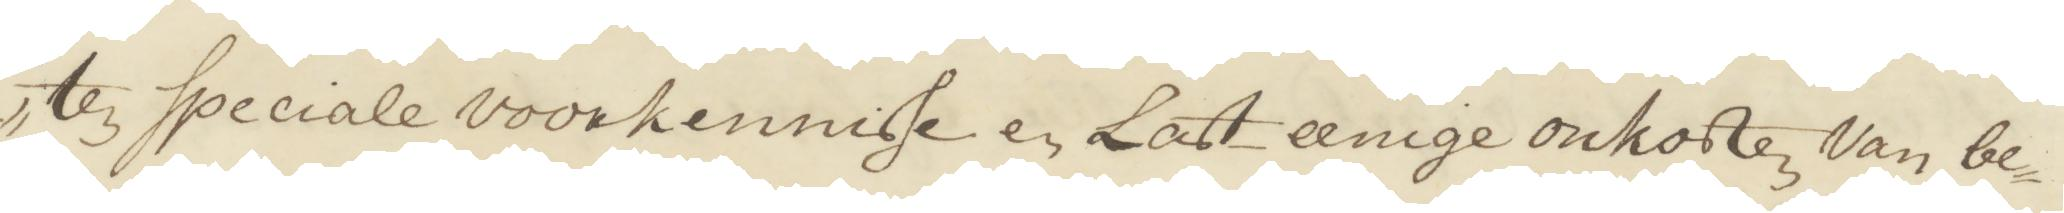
„ten speciale voorkennisse en Last eenige onkosten van be=
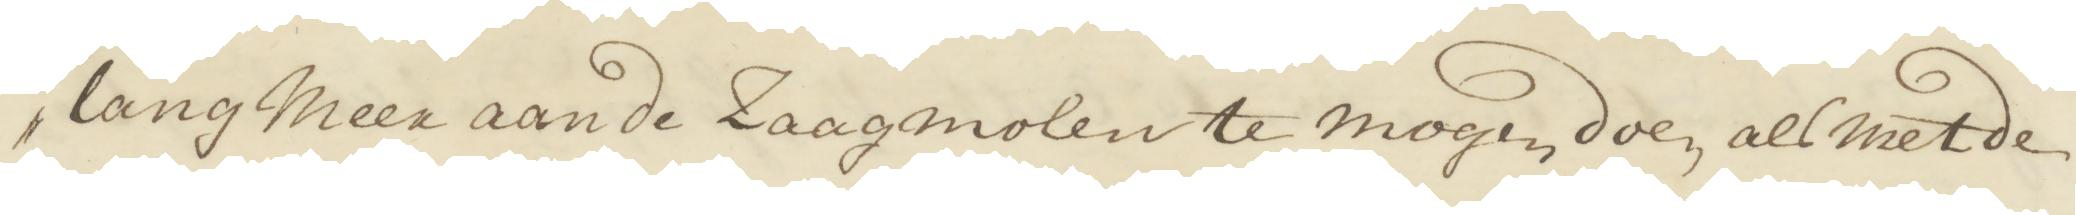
„lang meer aan de zaagmolen te mogen doen als met de
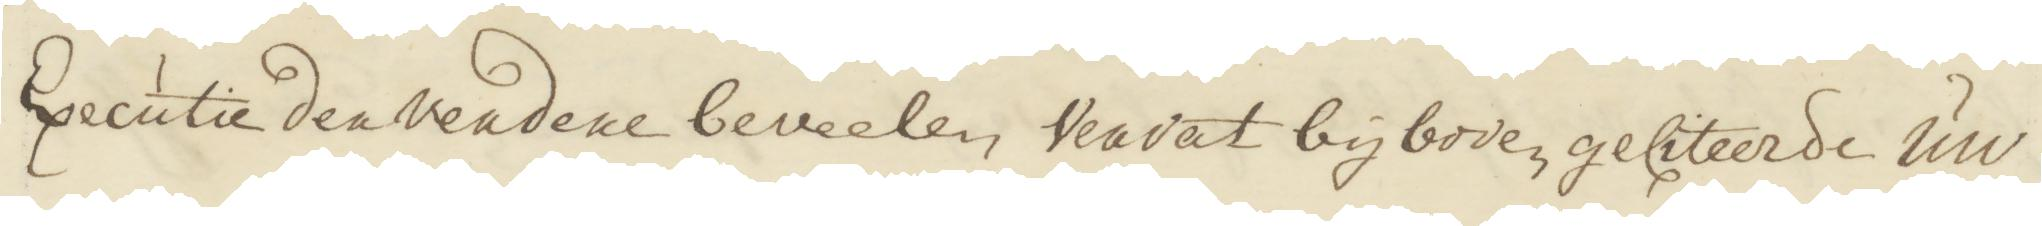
Executie der verdere beveelen vervat bij boven geciteerde uw
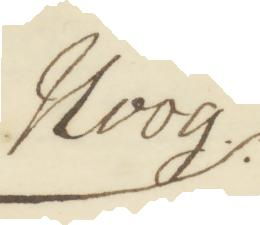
Hoog.
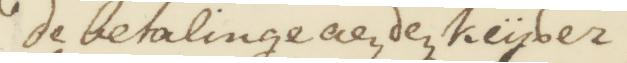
de betalinge aen den keijser
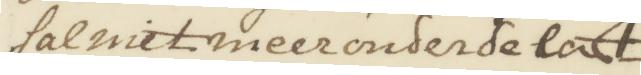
sal niet meer onder de last
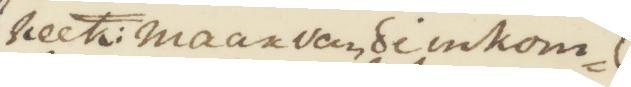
reek: maar van de inkom=
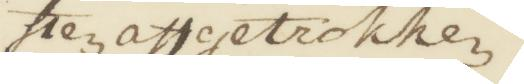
sten affgetrokken
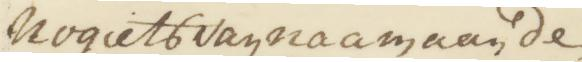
nog iets van naam aan de
